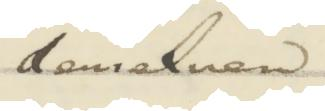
dencelven
